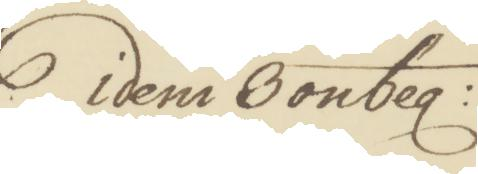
idem 3 onbeq:
